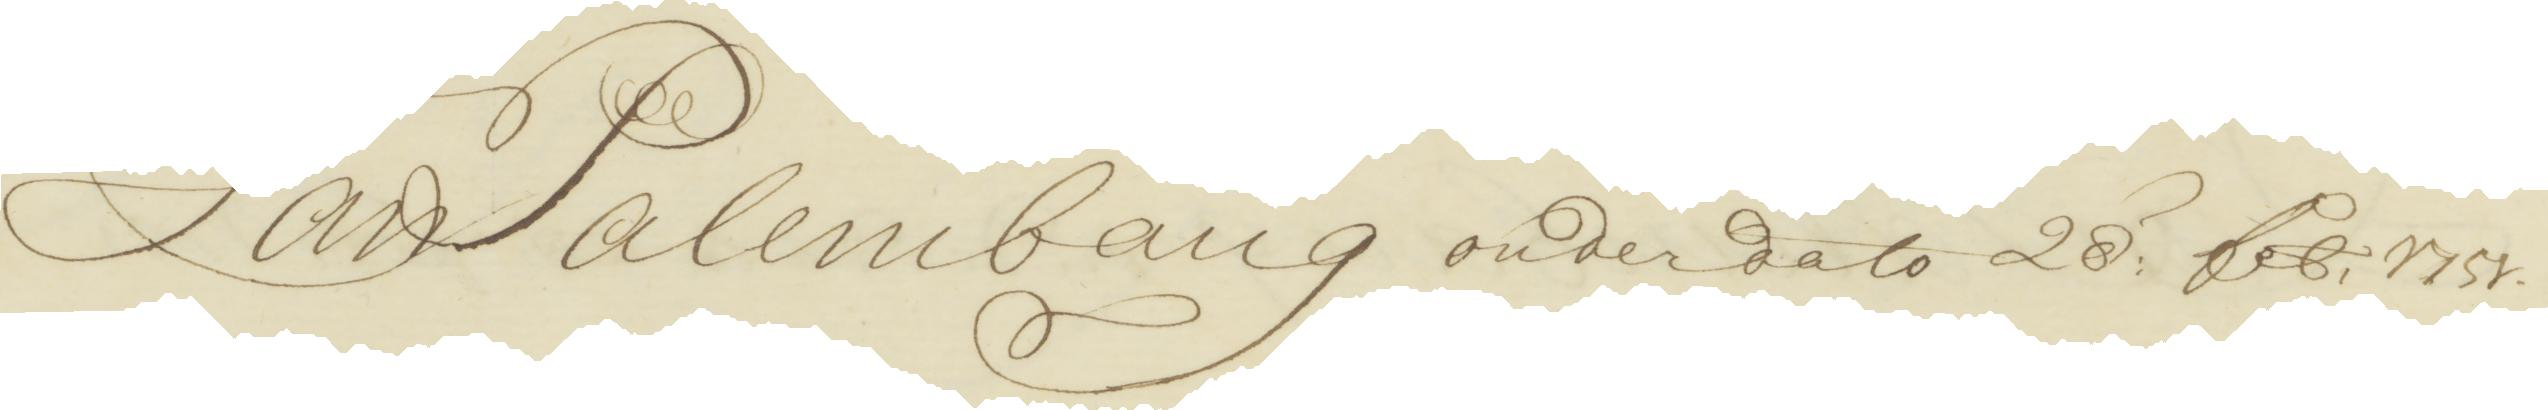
Van Palembang onder dato 28:' feb: 1751.
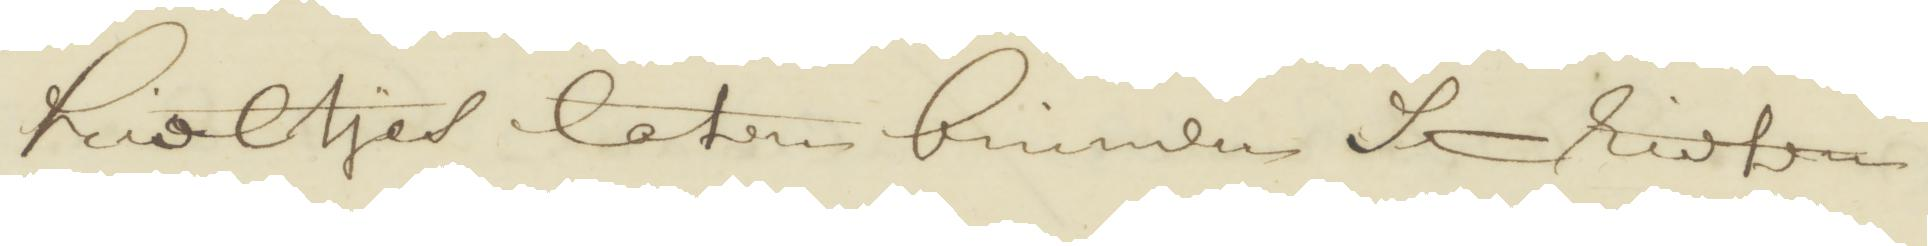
kieltjes laten binnen schieten
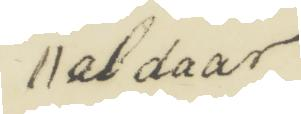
„aldaar
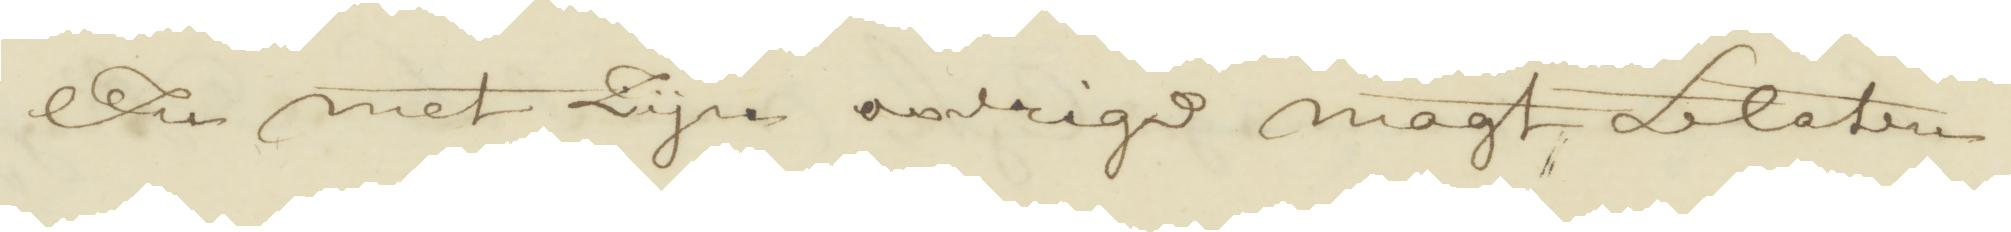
En met zijn overige magt „ telaten
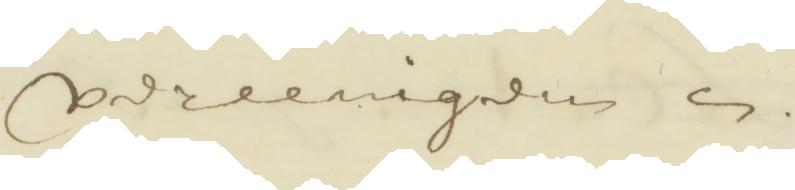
vereenigen —
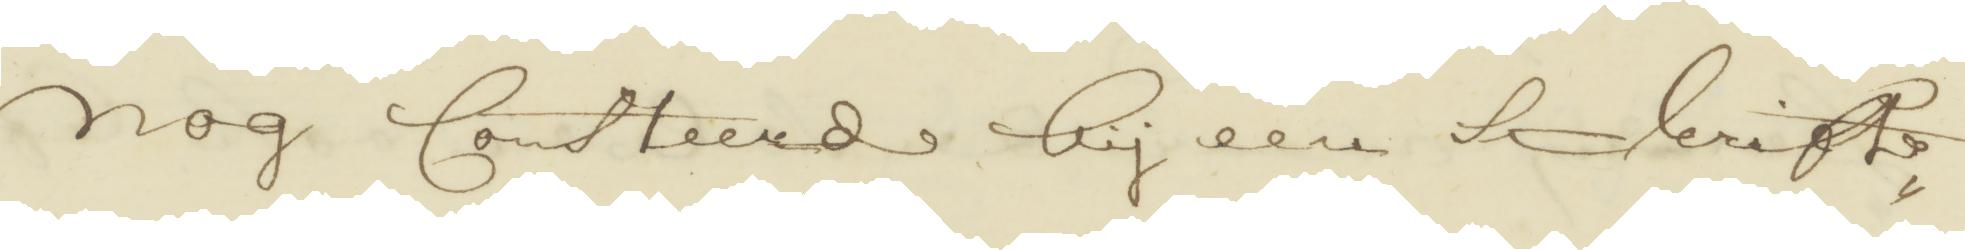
nog Consteerde bij een schrifte„
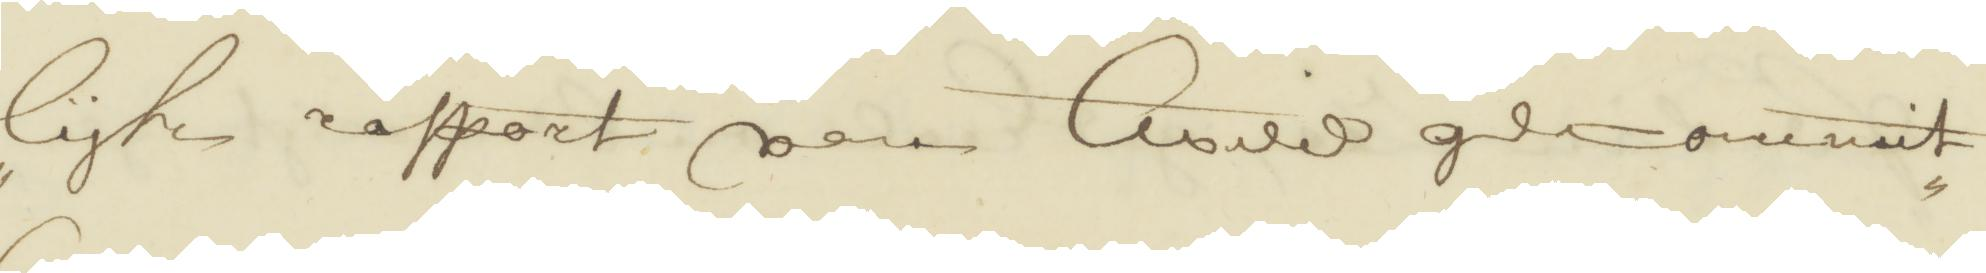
lijk rapport van twee gecommit„
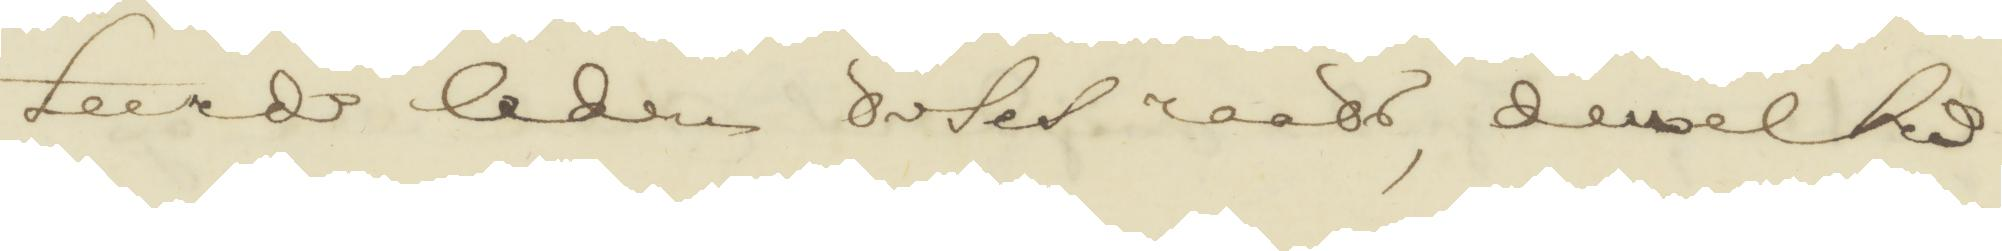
teerde leden deses raads, dewelke
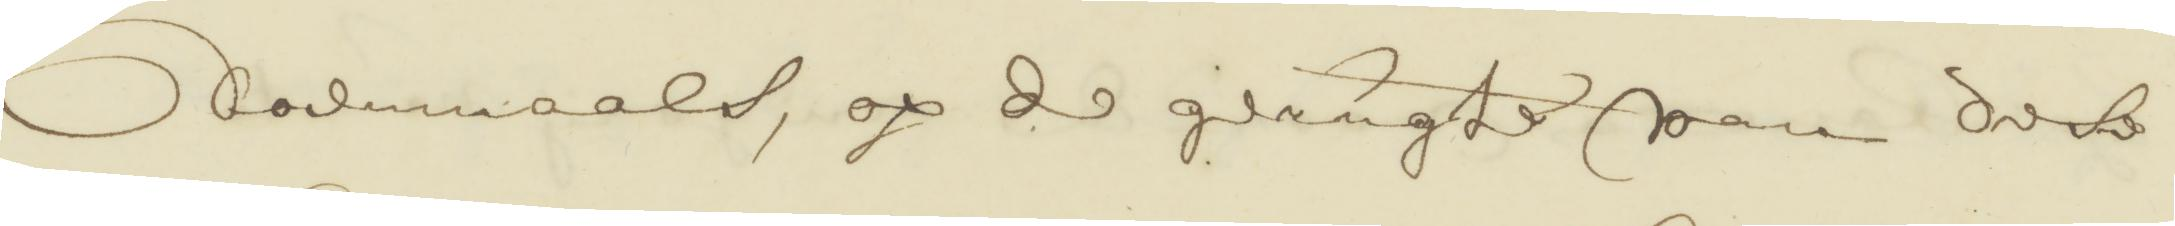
doenmaals, op de gerugte van dese
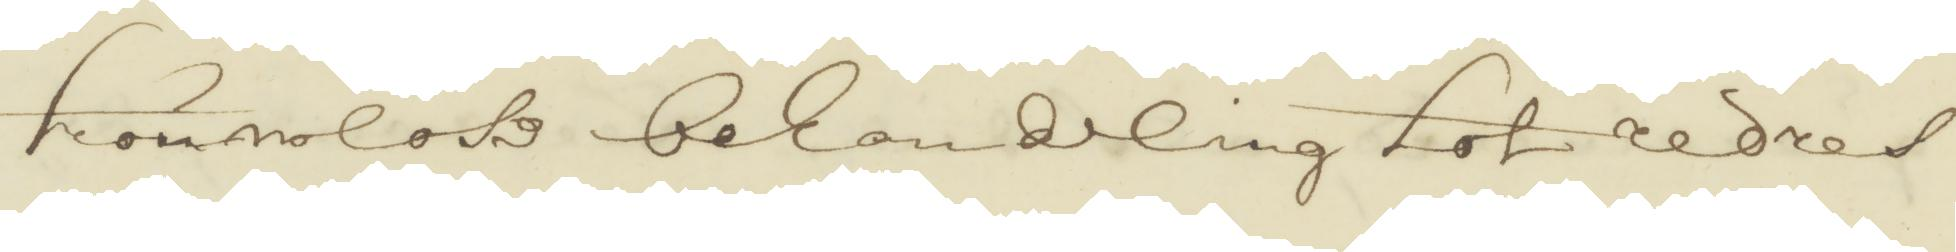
trouwlose behandeling tot redres
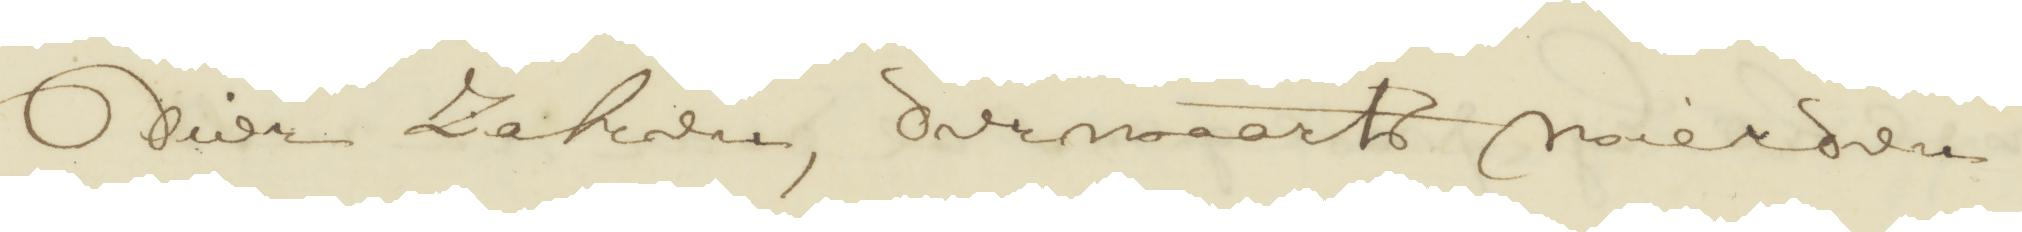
dier zaken, derwaarts wierden
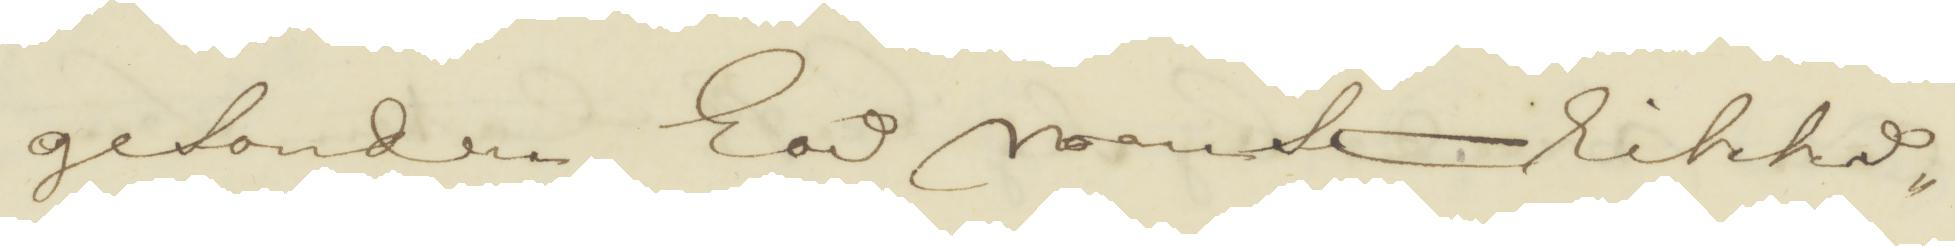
gesonden, hoe wanschikke„
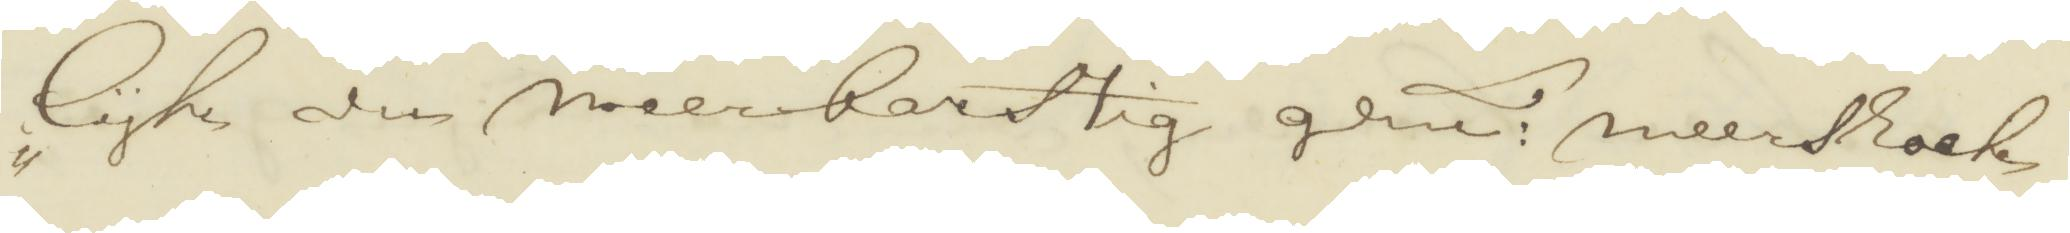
„lijk en weerbarstig gem: meershoek
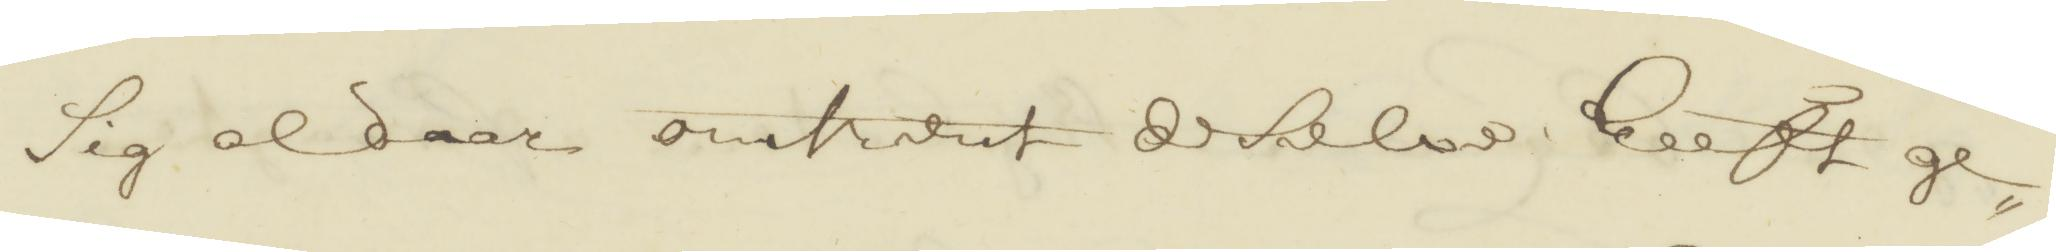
sig aldaar omtrent deselve heeft ge„
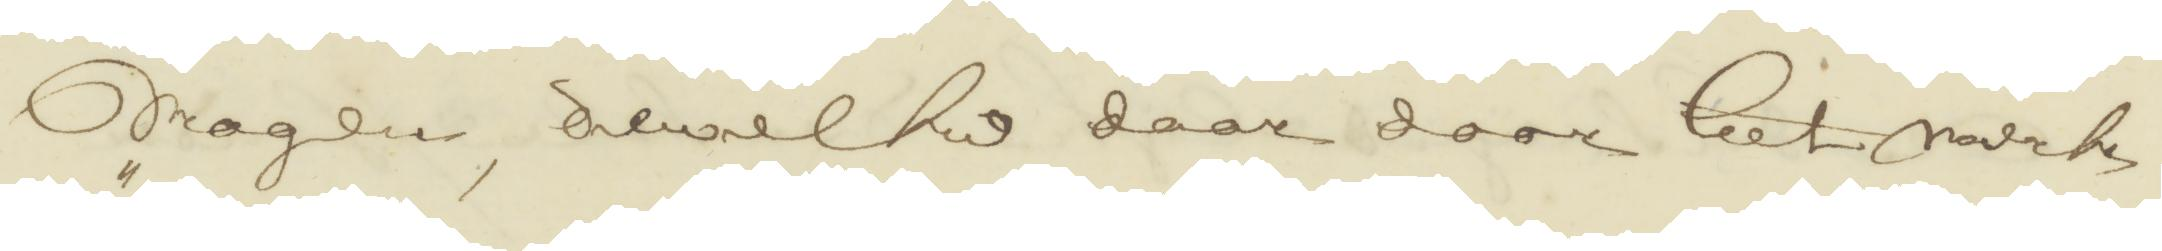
„dragen, dewelke daar door het werk
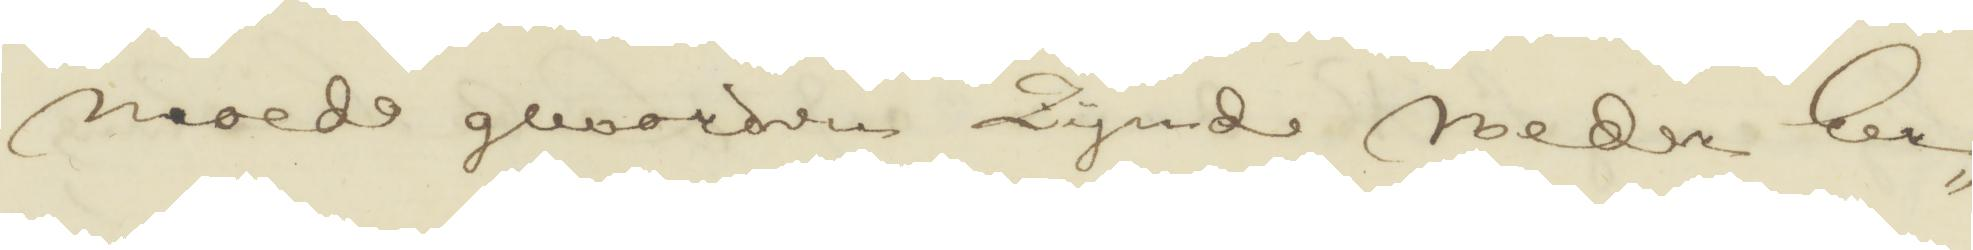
moede geworden zijnde, weder her„
